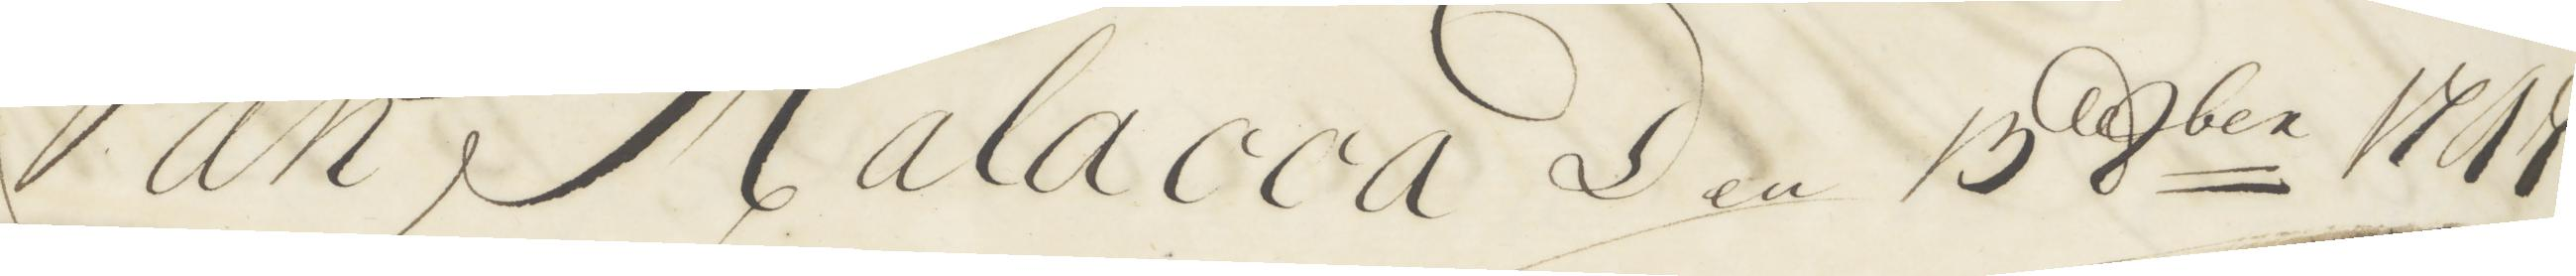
Van Malacca Den 13 8=ber 1747
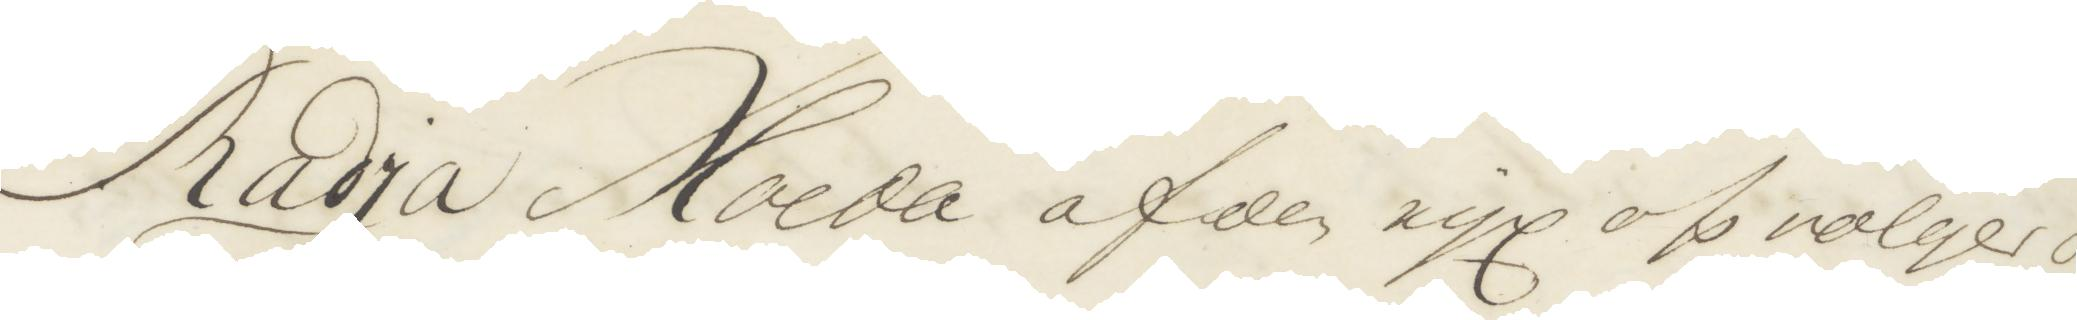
Radja Moeda af den rijx op volger
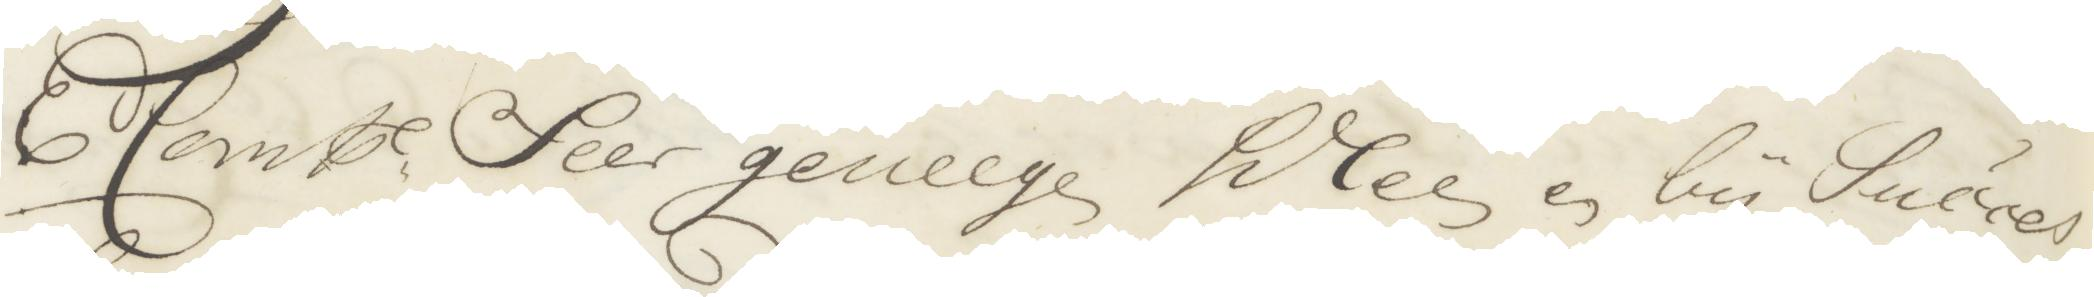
E Comp„e Seer geneegen scheen en bij succes
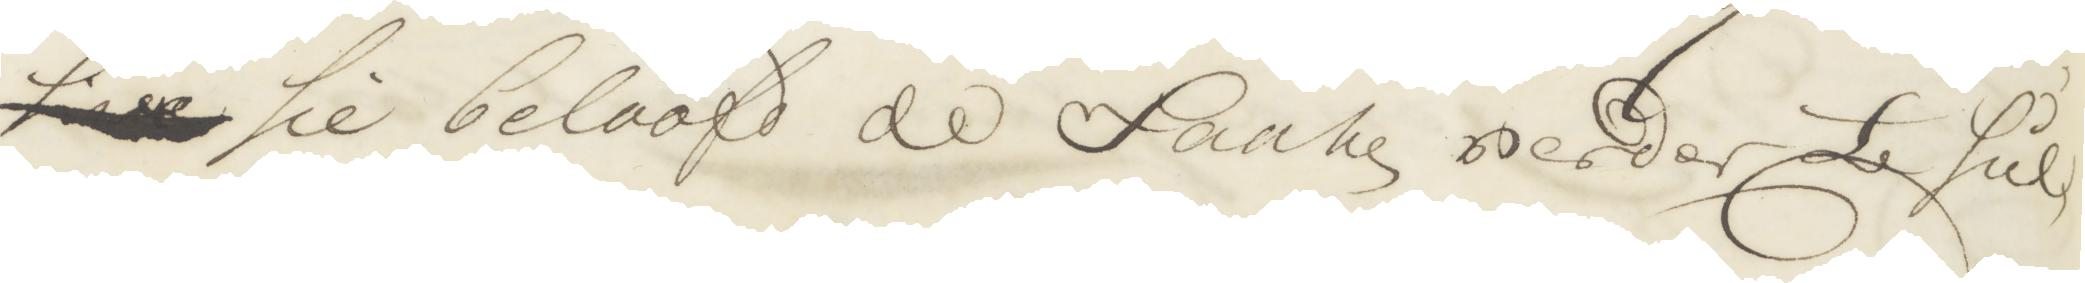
sive sie beloofd de saake verder te sul
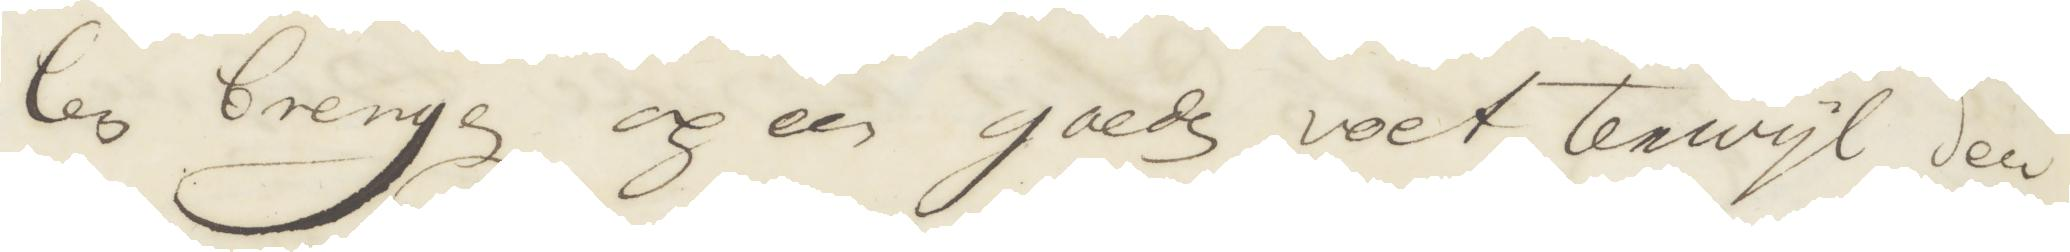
len brengen op een goeden voet, terwijl den
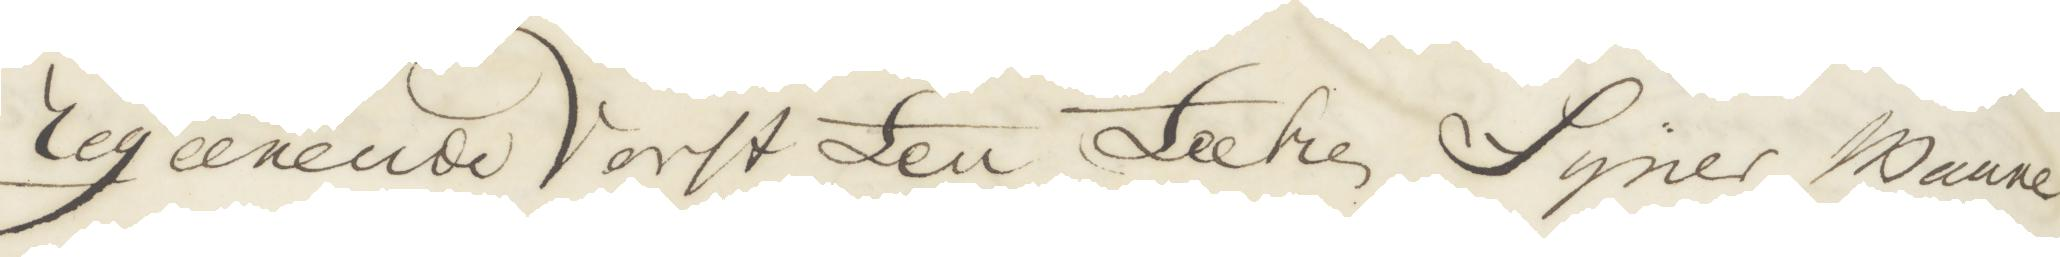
regeerende vorst ten teeken, sijner waare
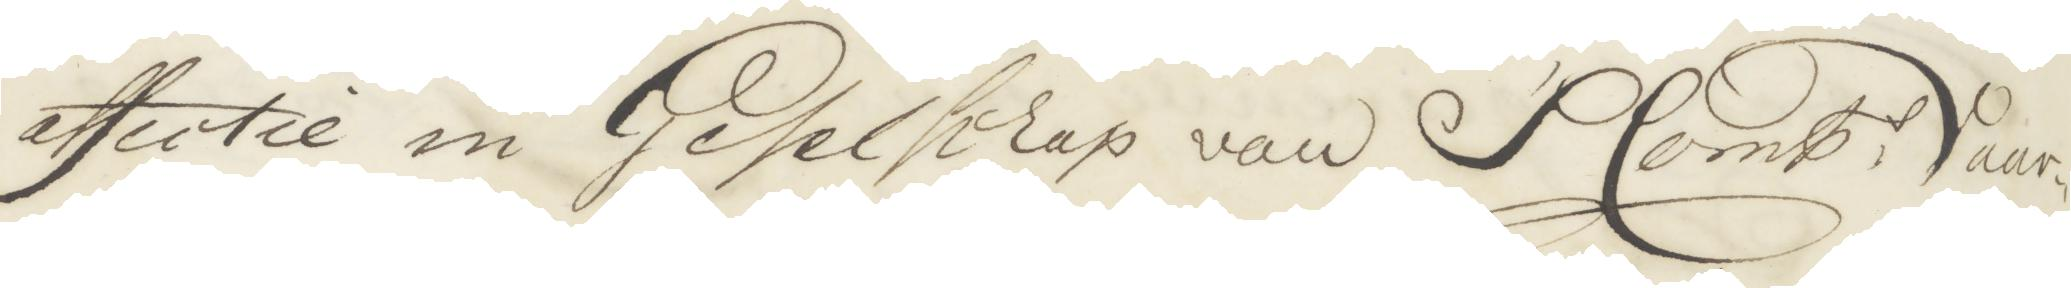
affectie in Geselschap van 's Comp:s vaar
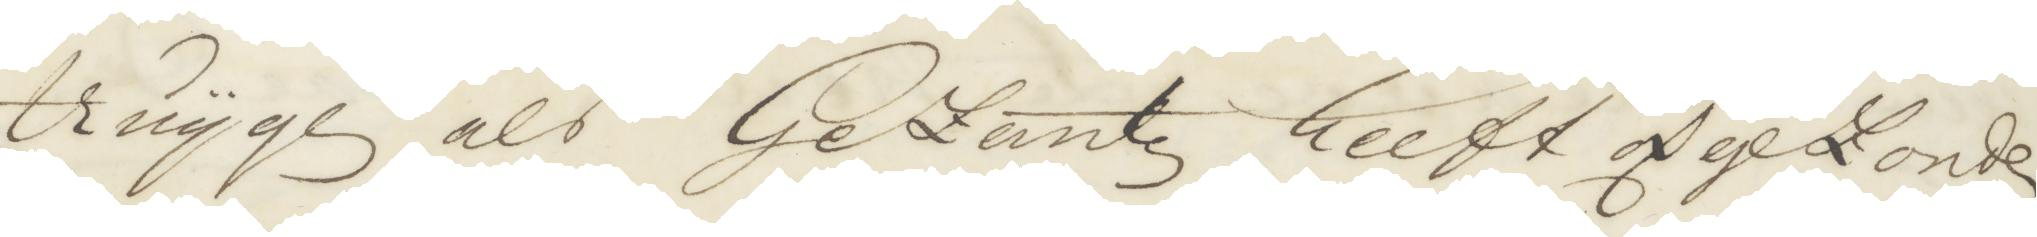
thuijgen als Gezanten heeft over gezonden
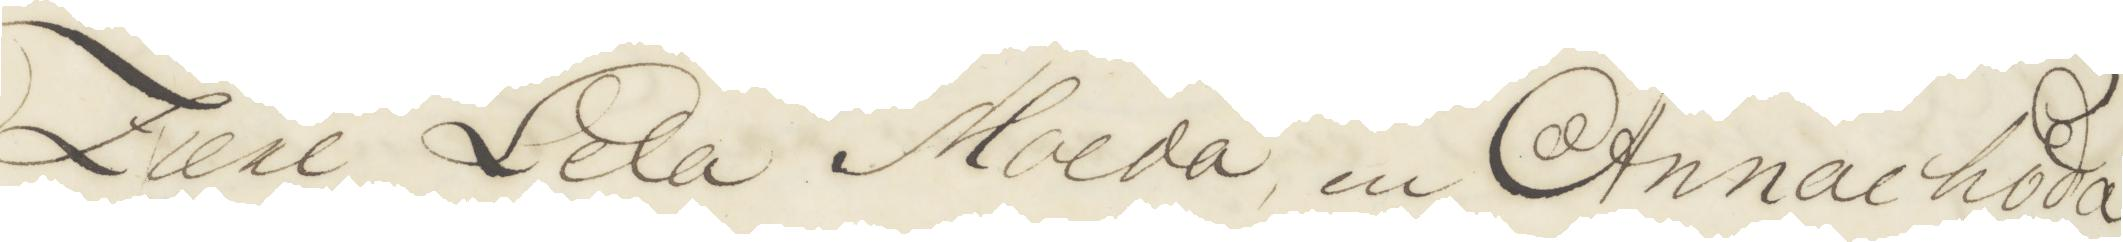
Ziere Lela Moeda, en Annachoda
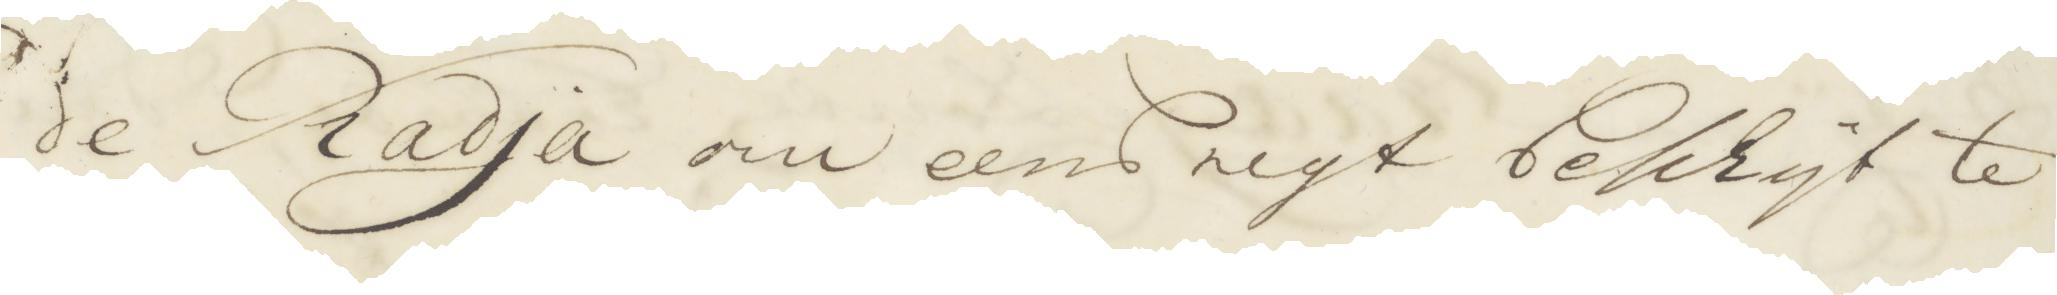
de Radja om eens regt beschijt te
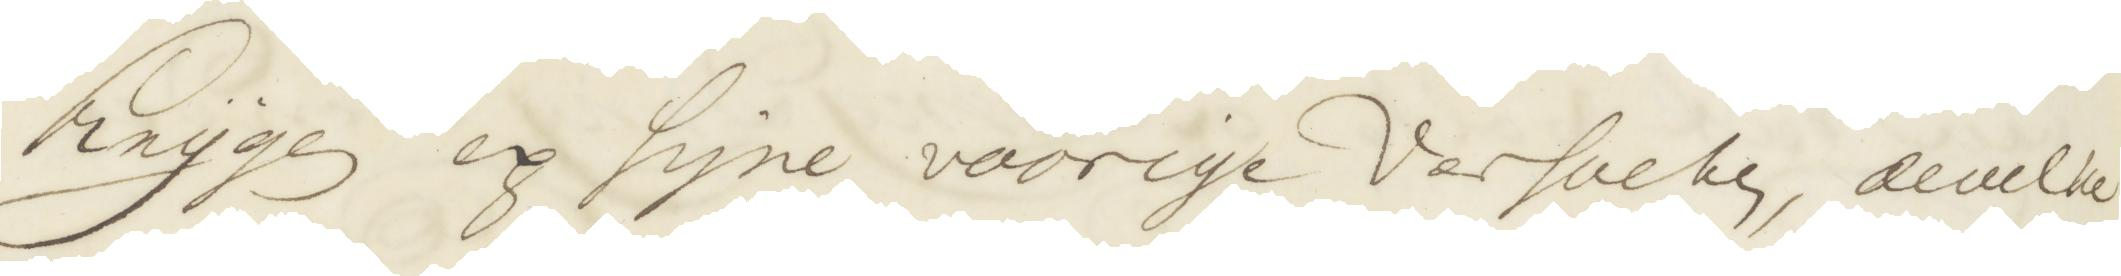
krijgen op sijne voorige versoeken, deuelke
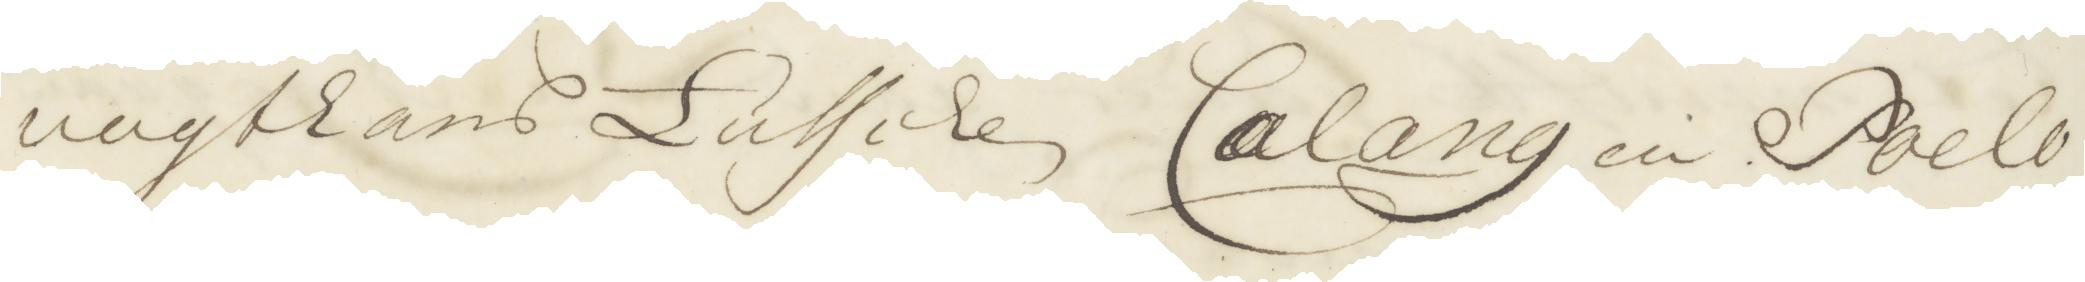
nogthans tusschen Calang en Poelo
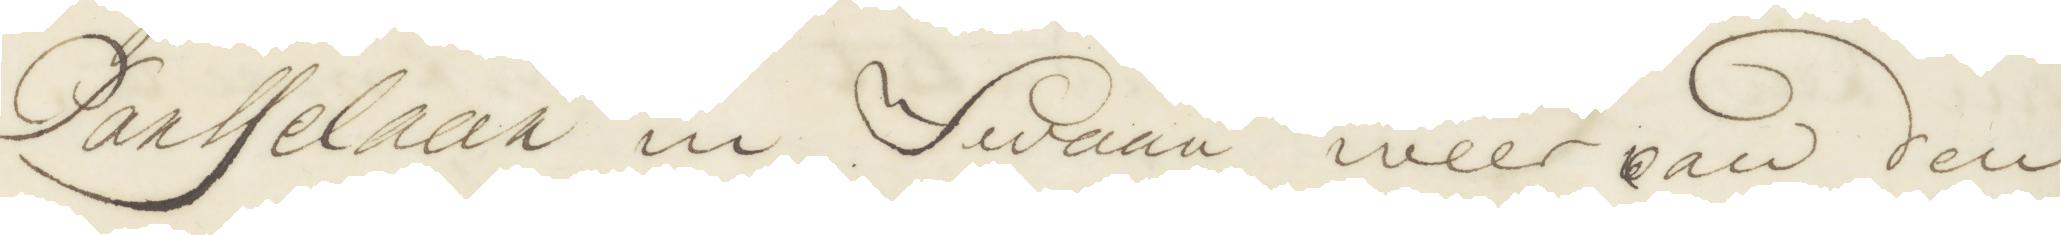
Passelaar in Swaar weer van den
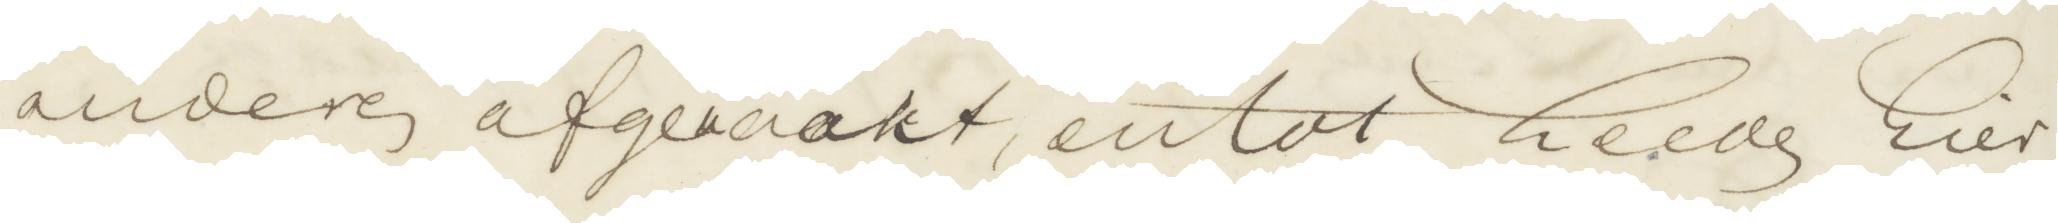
anderen afgeraakt, en tot heeden hier
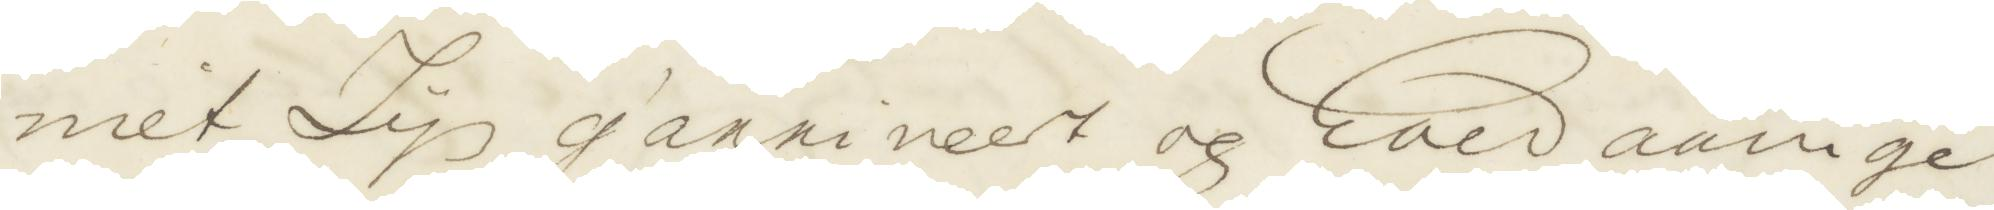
niet zijn g'arriveert op hoedaanige
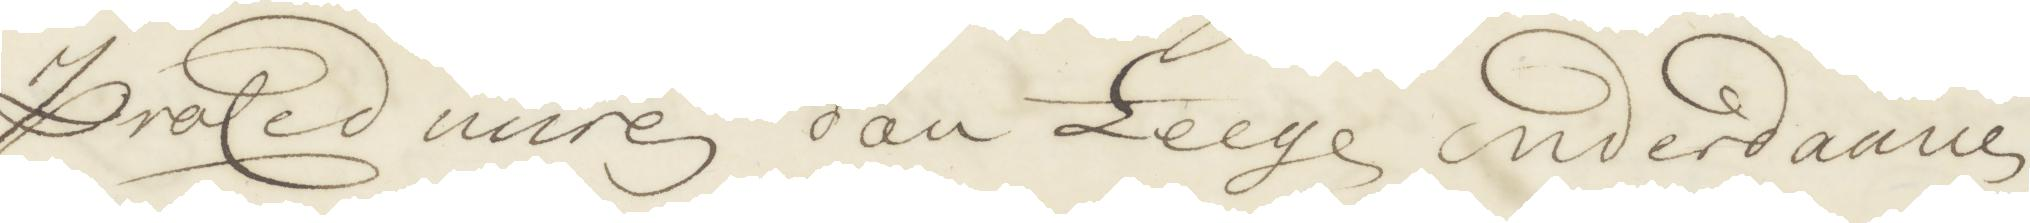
proceduuren dan teegen onderdaanen
